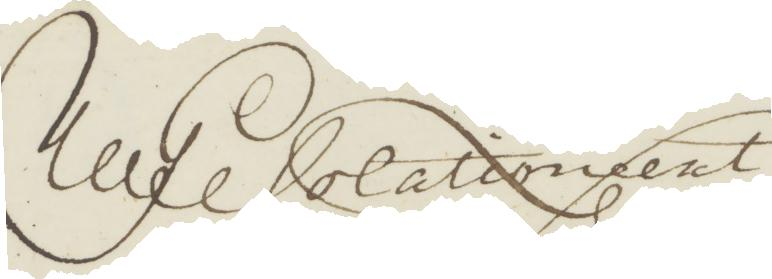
reede Colationeert
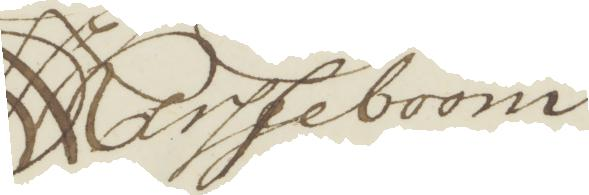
Kersseboom
